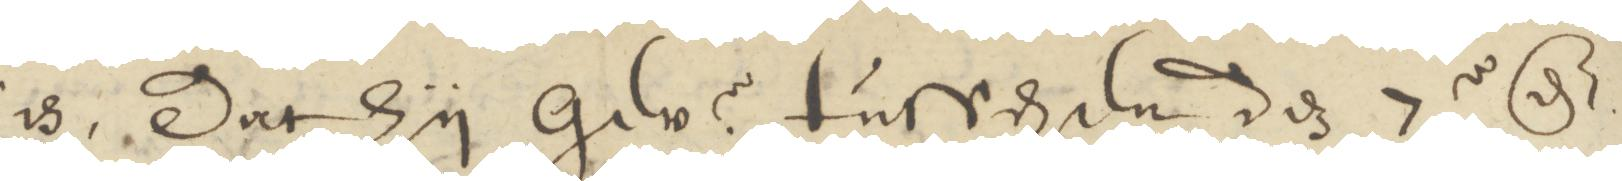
is, Dat hij gev:e tusschen den 7:e ende
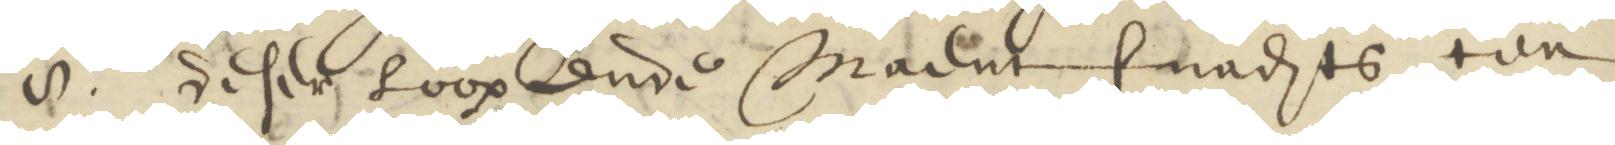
8.en deser loopende maent snachts ten
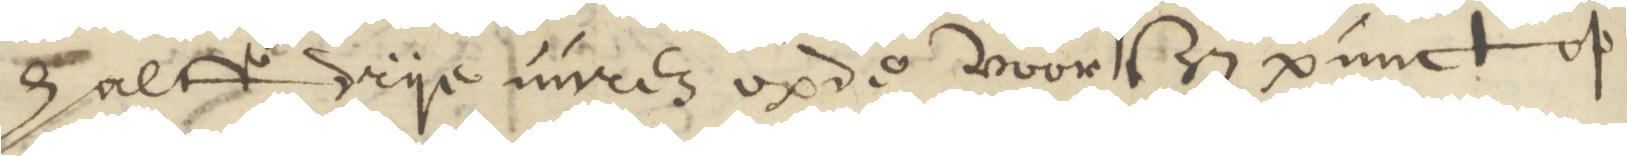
halff drije uuren op de voorsten punct op
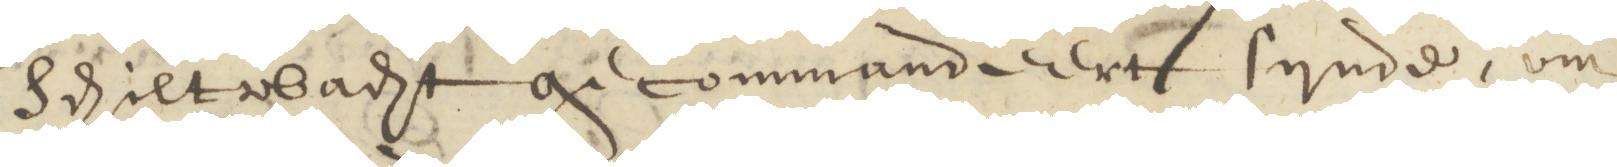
schiltwacht gecommandeert synde, om
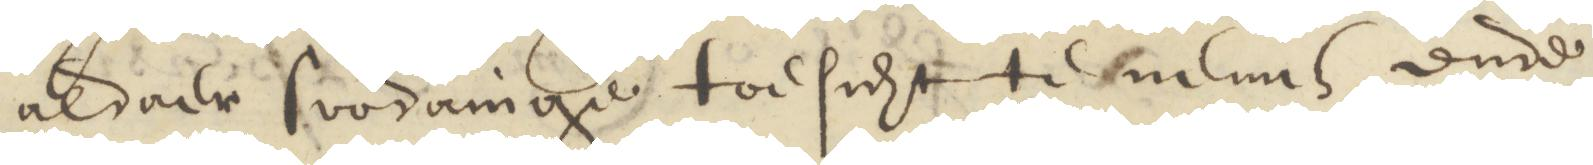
aldaer soodanige toesicht te nemen ende
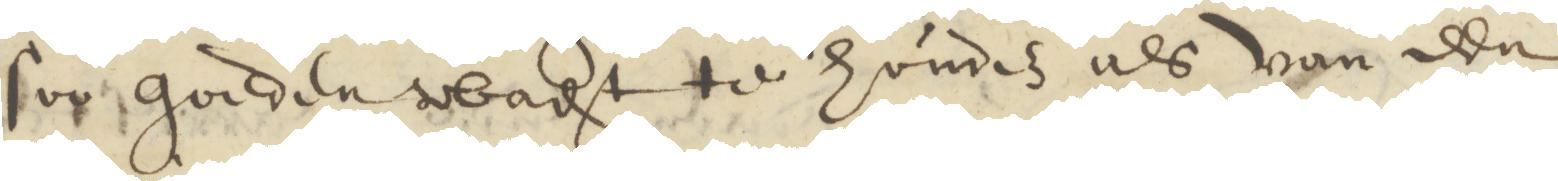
soo goeden wacht te houden als van een
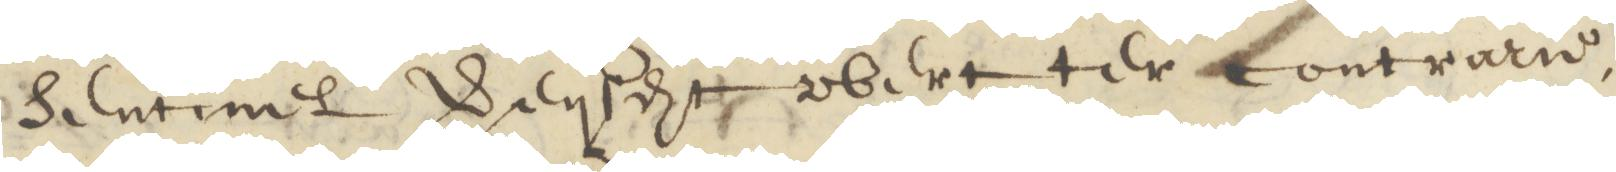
sentinel vereyscht wert ter contrarie,
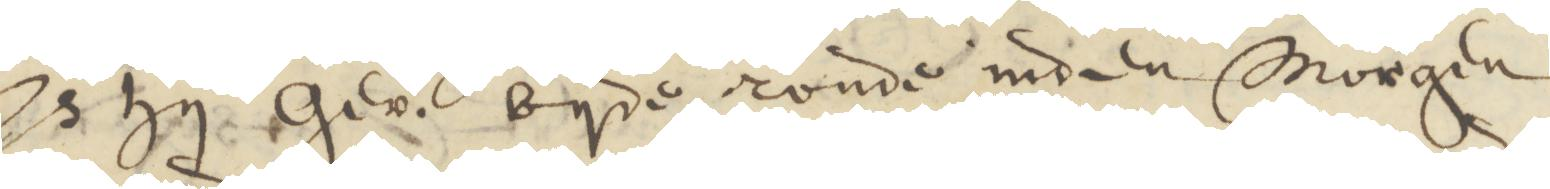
Is hij gev.e byde ronde inden morgen
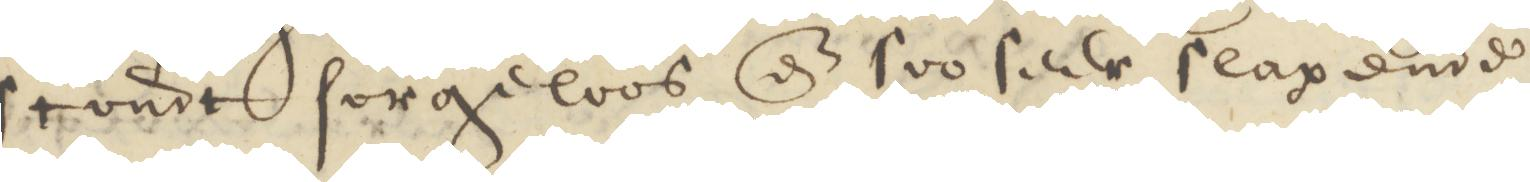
stondt sorgeloos ende soo seer slapende
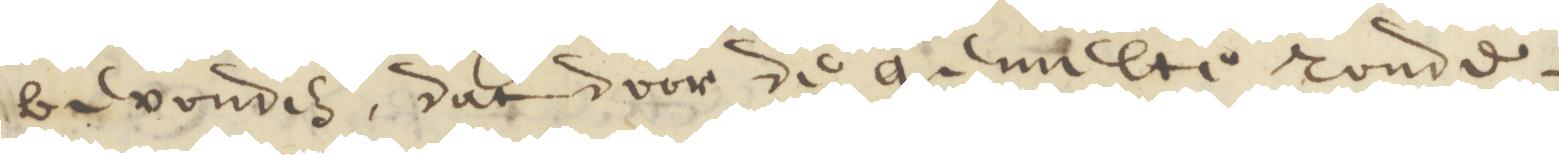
bevonden, dat door de gemelte ronde -
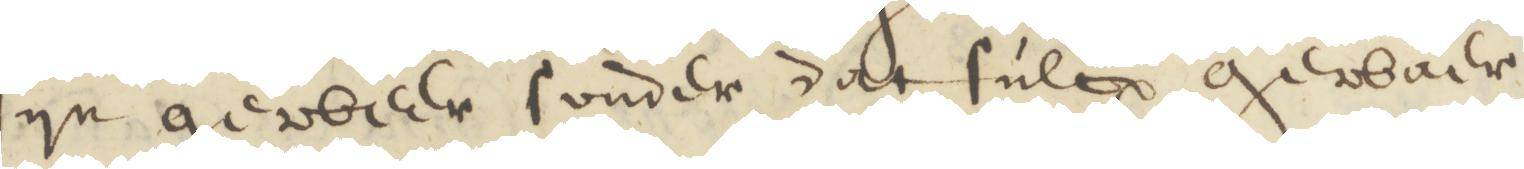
syn geweer sonder dat sulcx gewaer
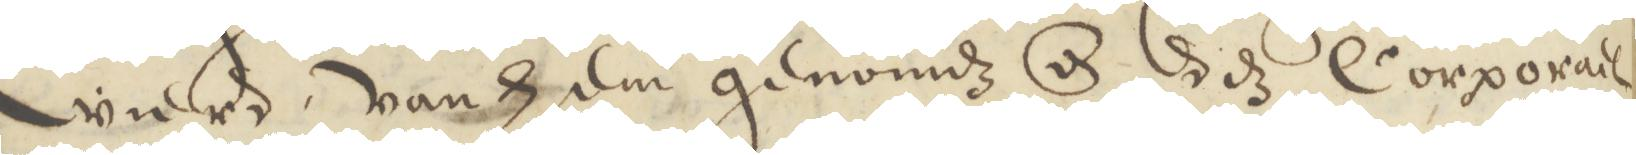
wierd, van hem genomen ende den Corporael
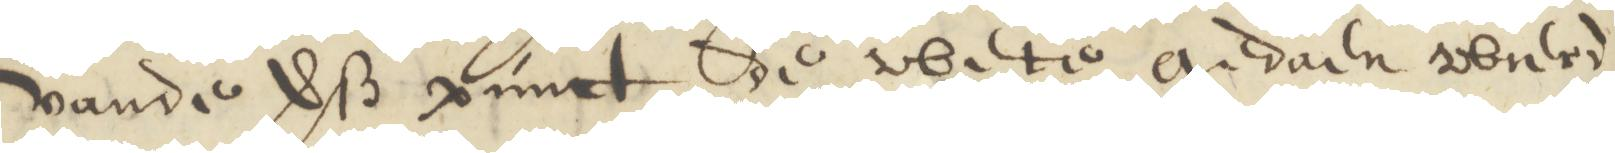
vande versz punct de wete gedaen wierd
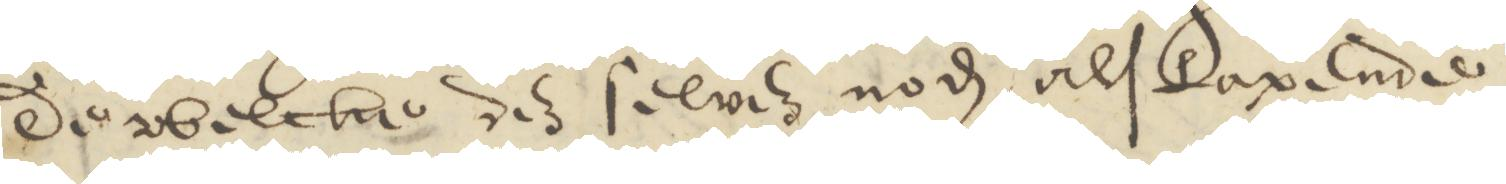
de welcke den selven noch alslapende
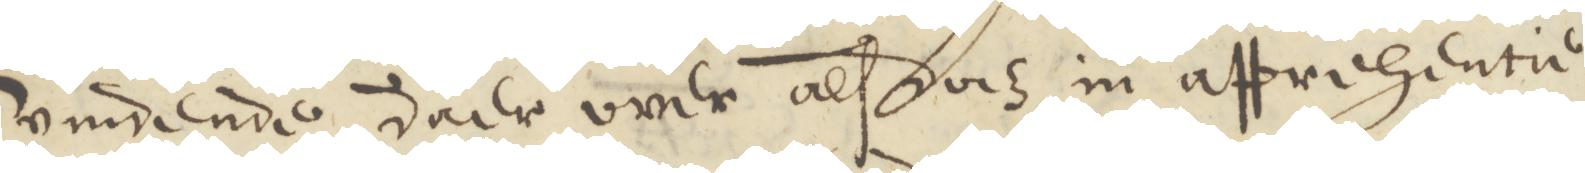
vindende daer over alsdoen in apprehentie
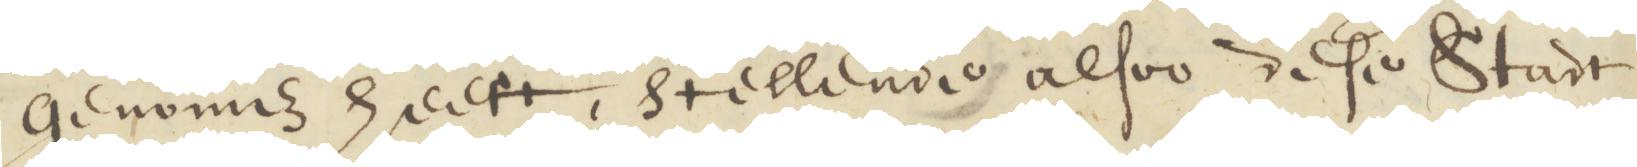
genomen heeft, stellende alsoo dese Stadt
